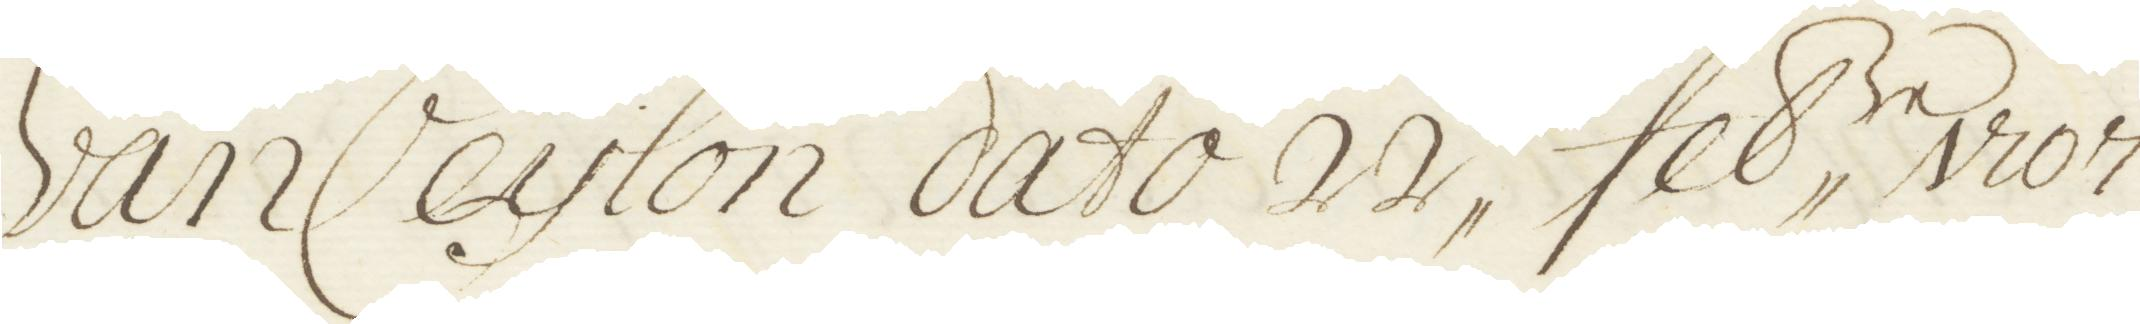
Van Ceijlon dato 22„e feb„r 1707
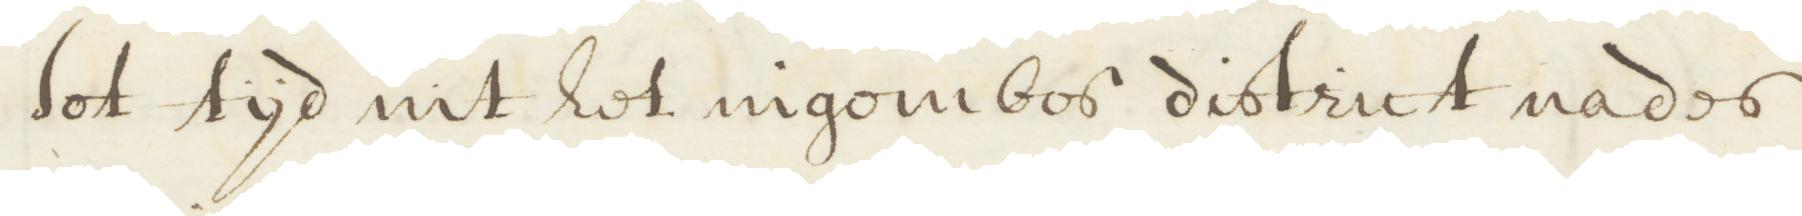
tot tijd uit het nigombos district na des
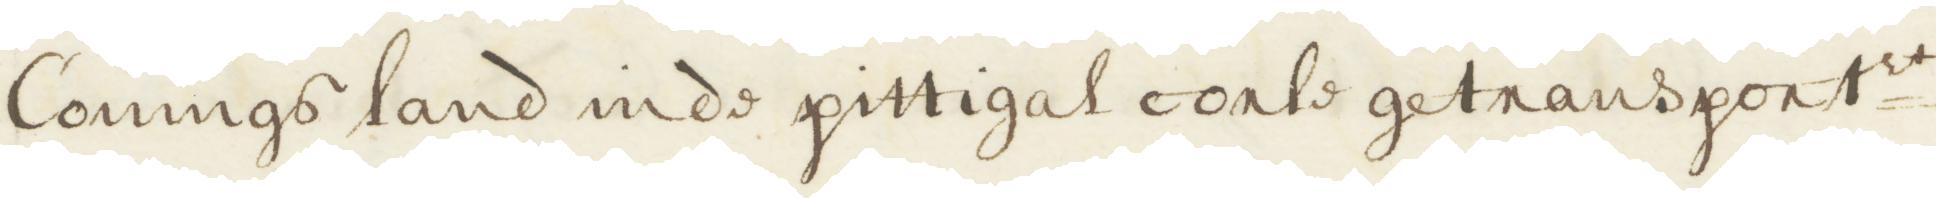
Conings land in de pittigal corle getransport=rt
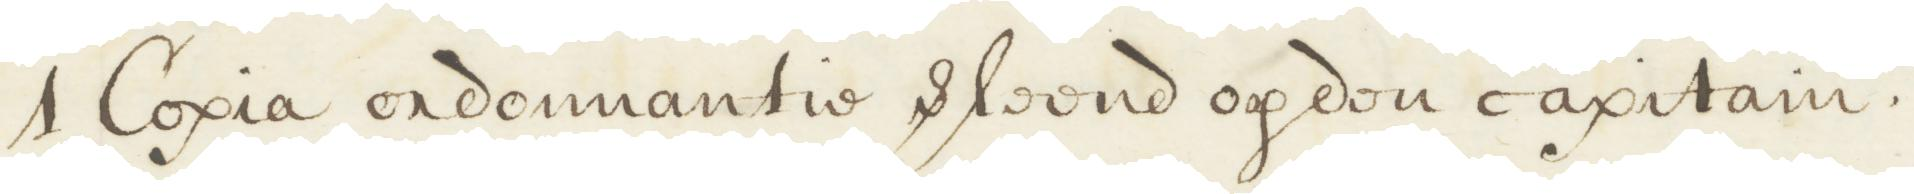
1 Copia ordonnantie verleend op den capitain.
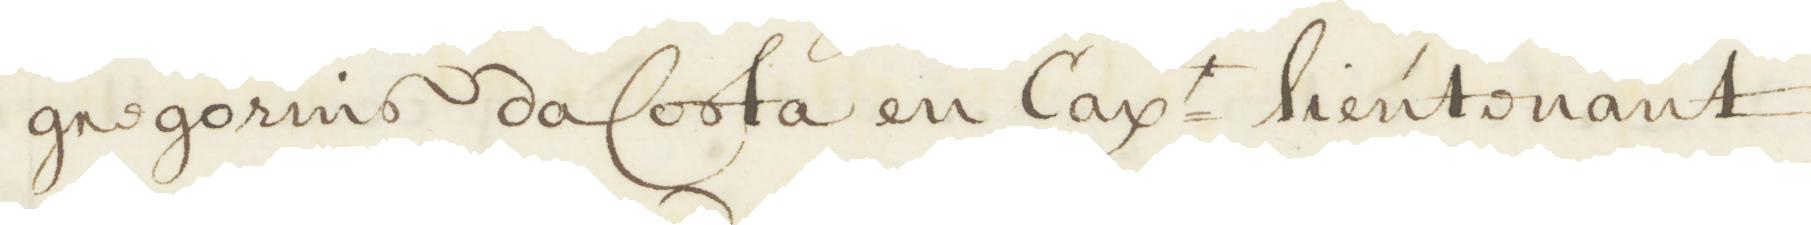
gregorius da Costa en Cap=t lieutenant
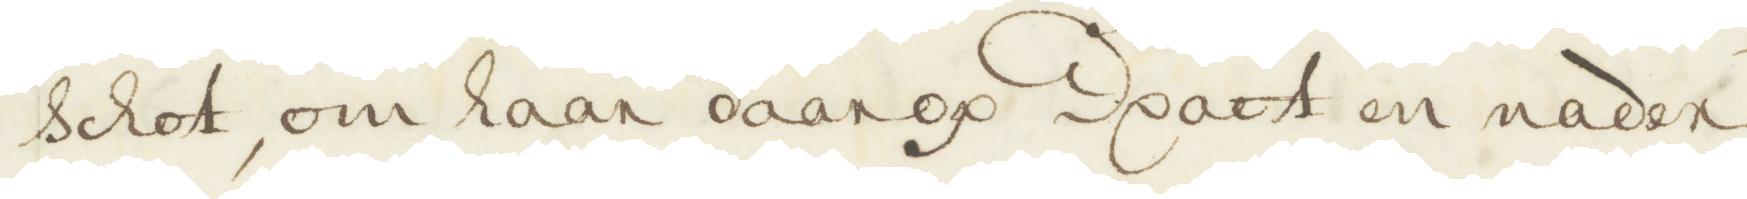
schot, om haar daarop Exact en nader
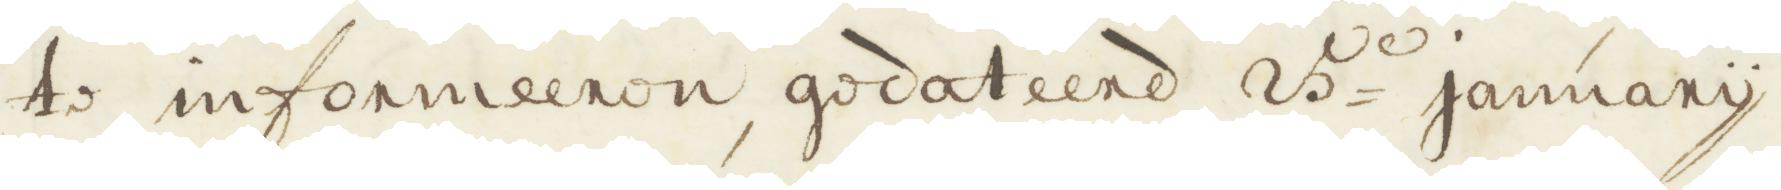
te informeeren, gedateerd 25=e januarij
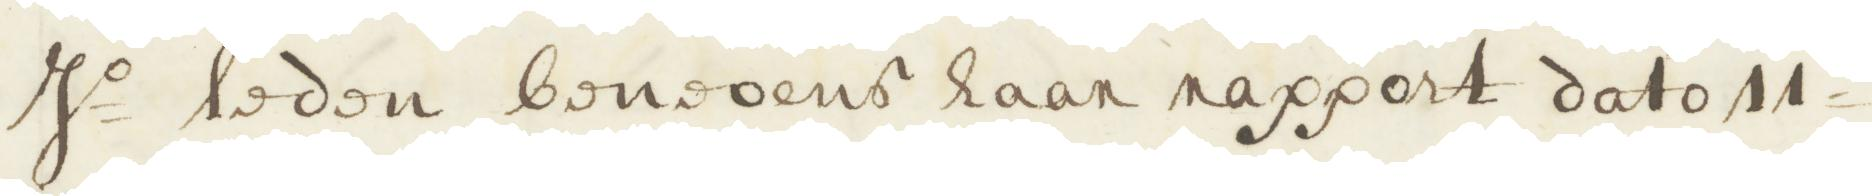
J=o leden, benevens haar rapport dato 11=e
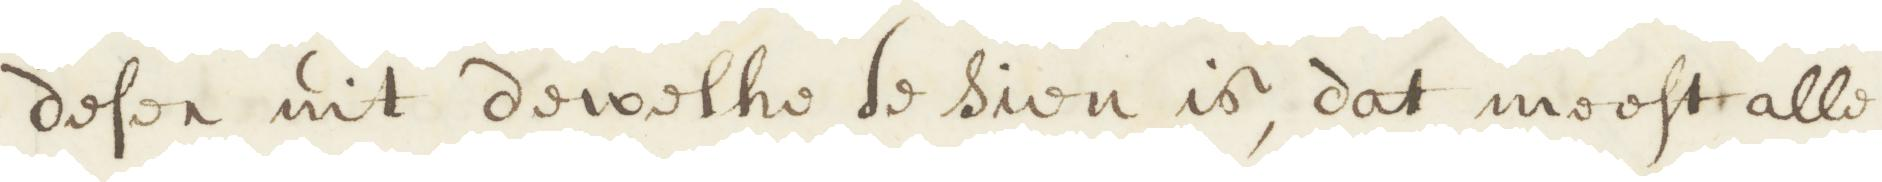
deser uit dewelke te sien, is, dat meest alle
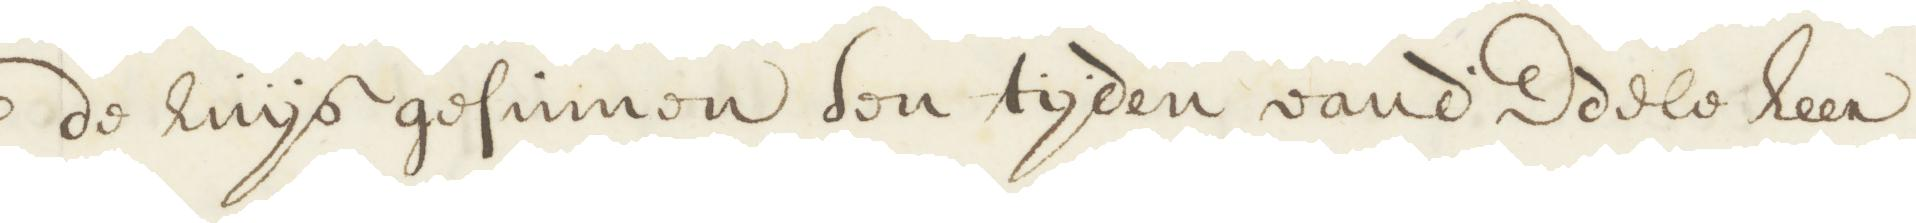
de huijs gesinnen ten tijden van d’Edele heer
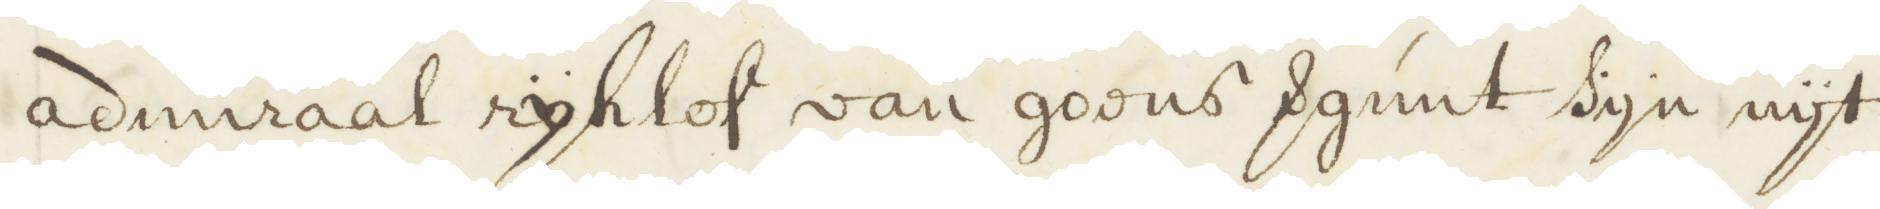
admiraal rijklof tof van goens vergunt sijn uijt
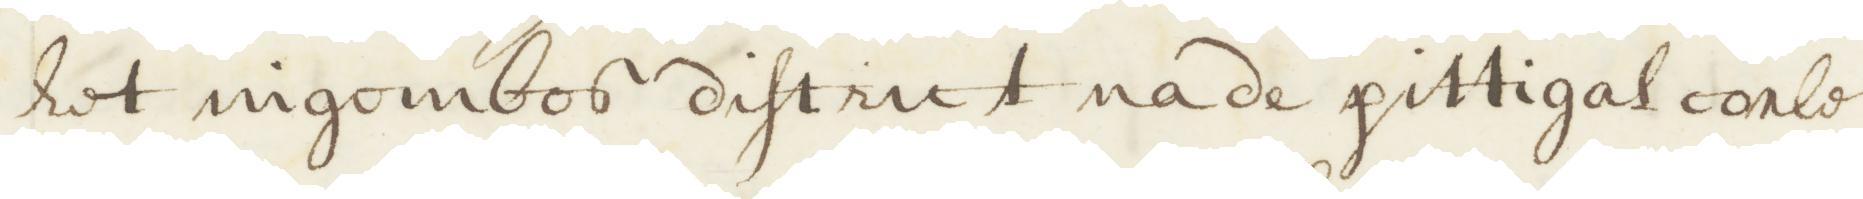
het nigombos district na de pittigal corle
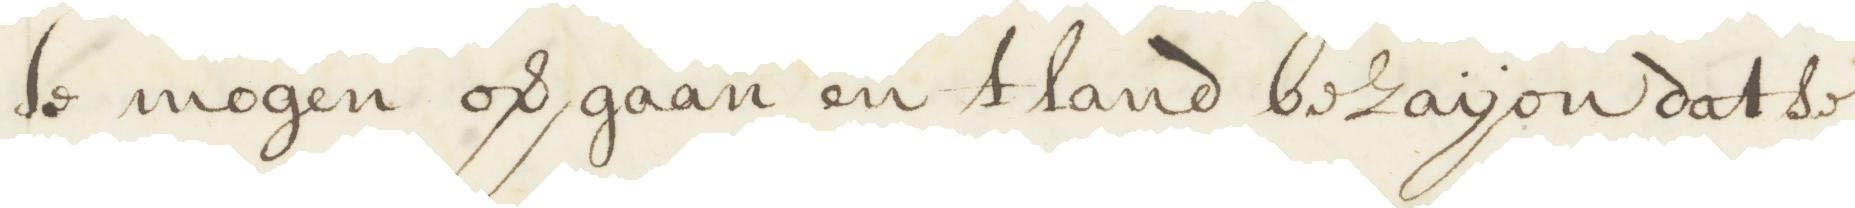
te mogen overgaan, en t land bezaijen dat so
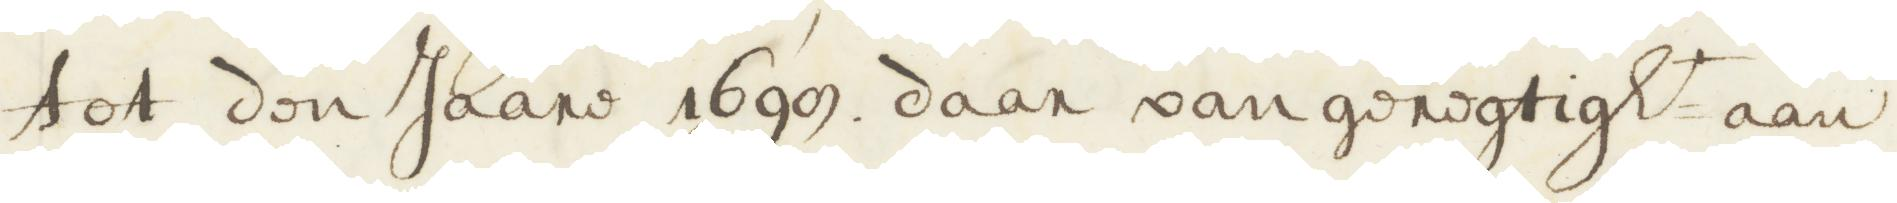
tot den Jaare 1698. daar van geregtigh=t aan
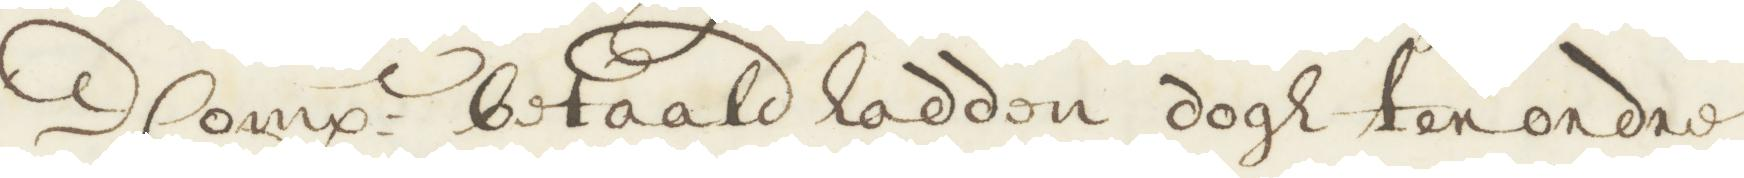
d' E Comp=e betaald hadden, dogh ter ordre
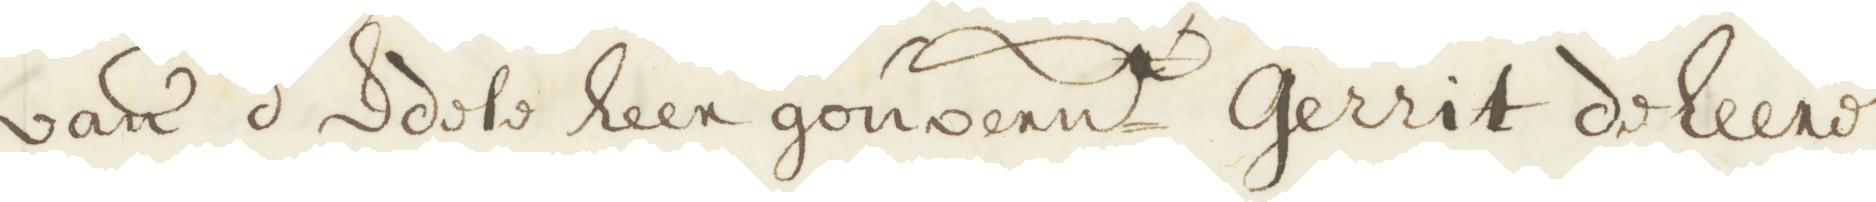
van d' Edele heer gouvern=r Gerrit de heere
